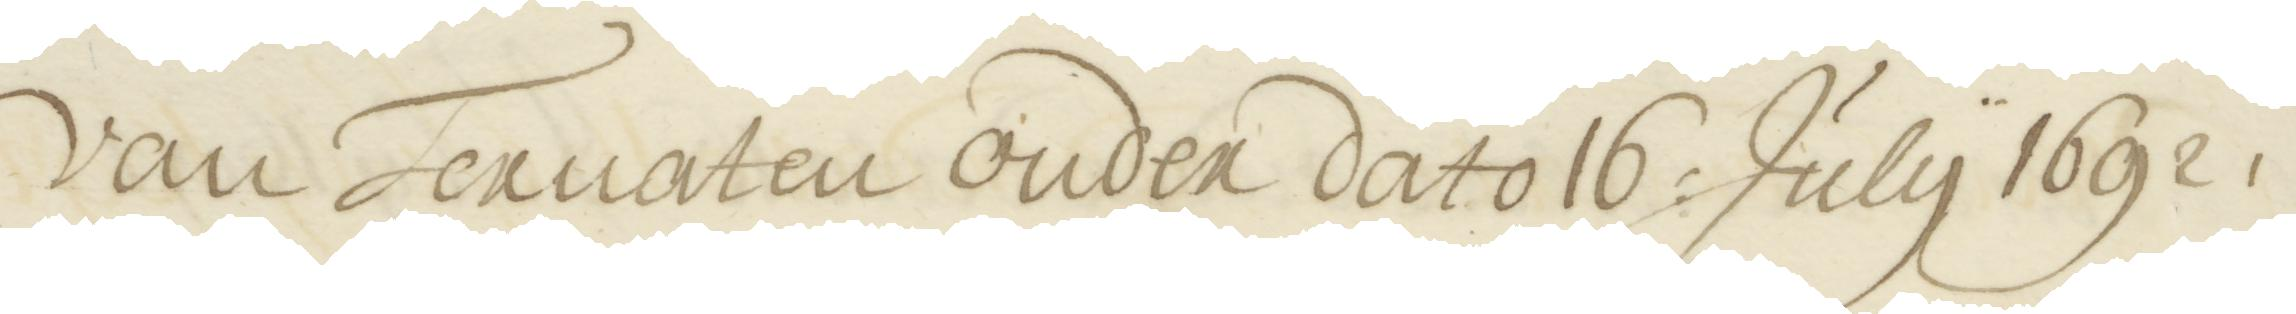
van Ternaten onder dato 16: Julij 1692 ,
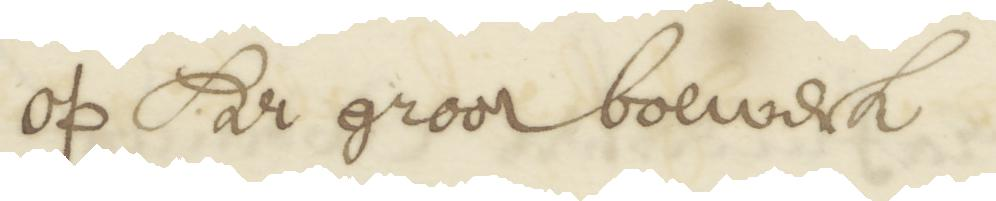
op Het groot bolwerk
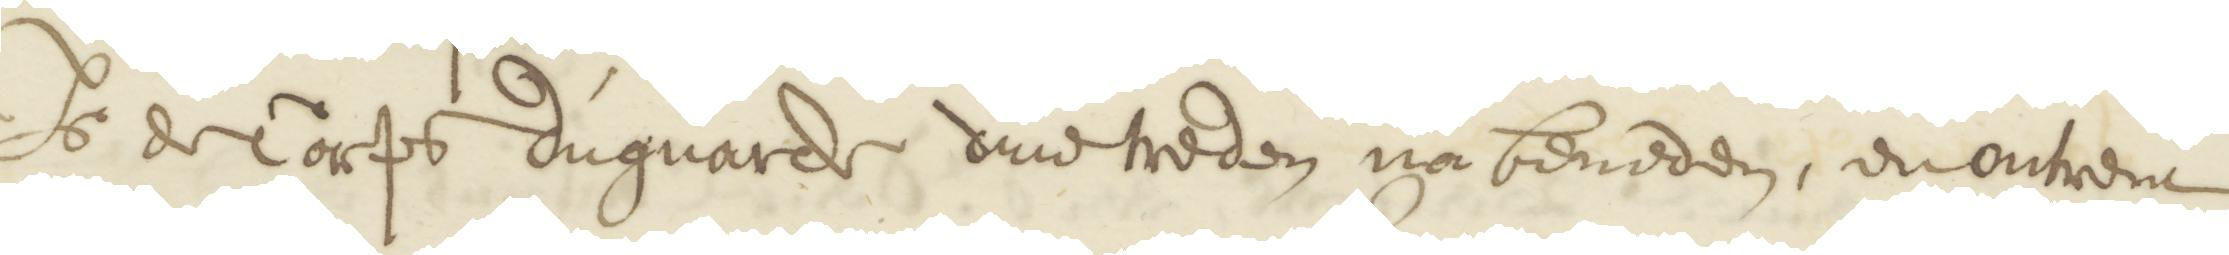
Is de Corps duguarde drie treden na beneden, en ontrent
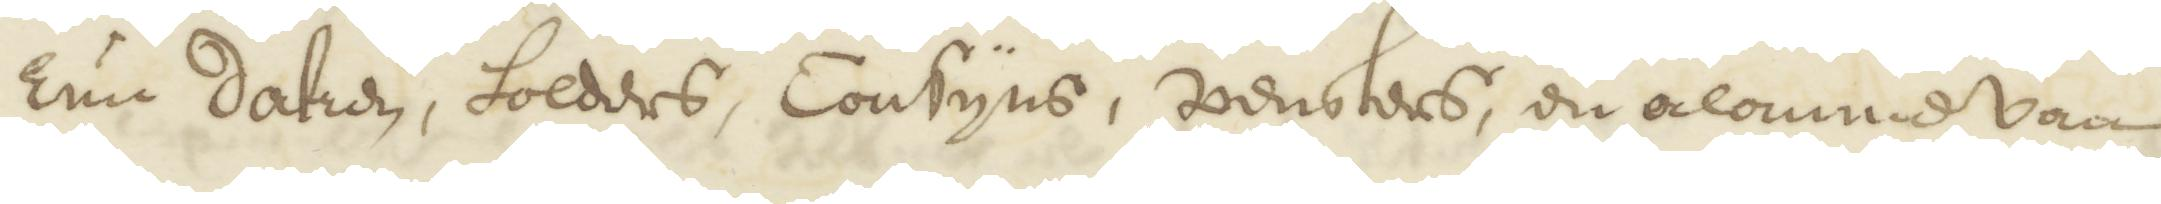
hun daken, solders, Cousijns, vensters, en alomme van
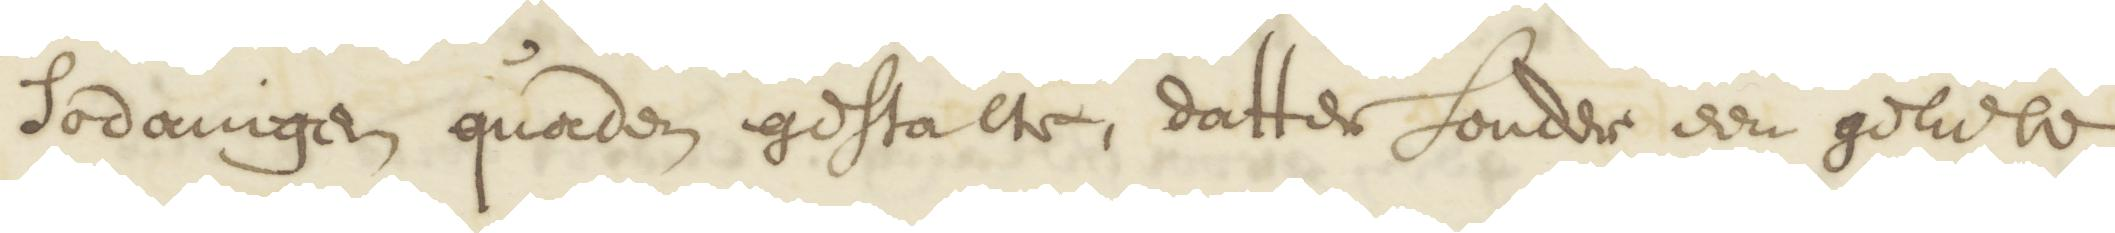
sodanigen quaden gestalte, datter sonder een gehele
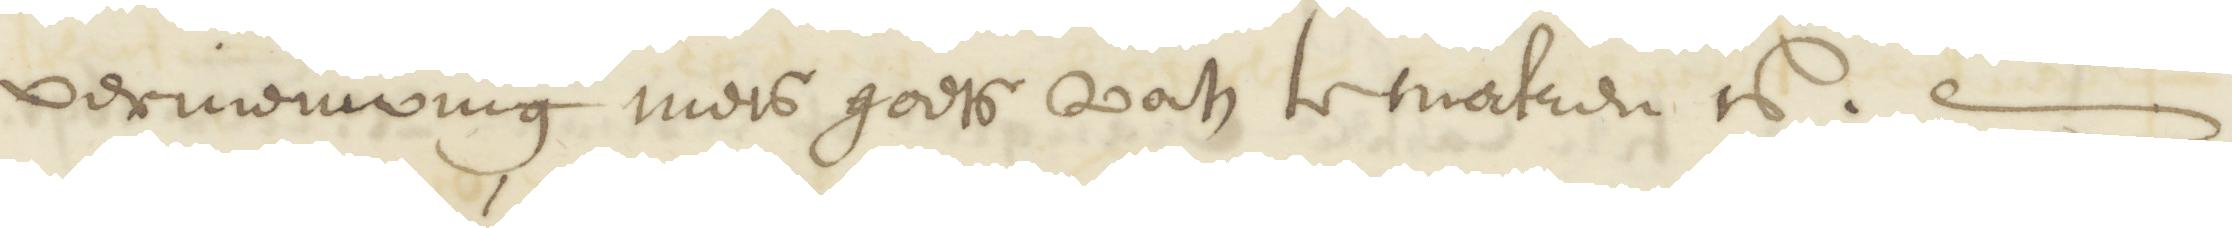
vernieuwing niets goets van te maken is. —
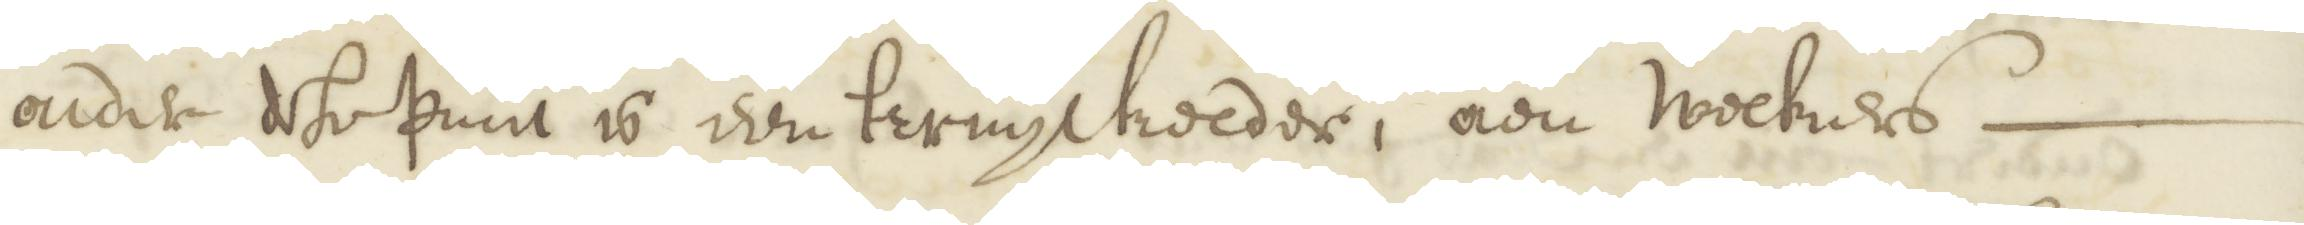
onder dese punt is een kruijtkelder, aen welkers —
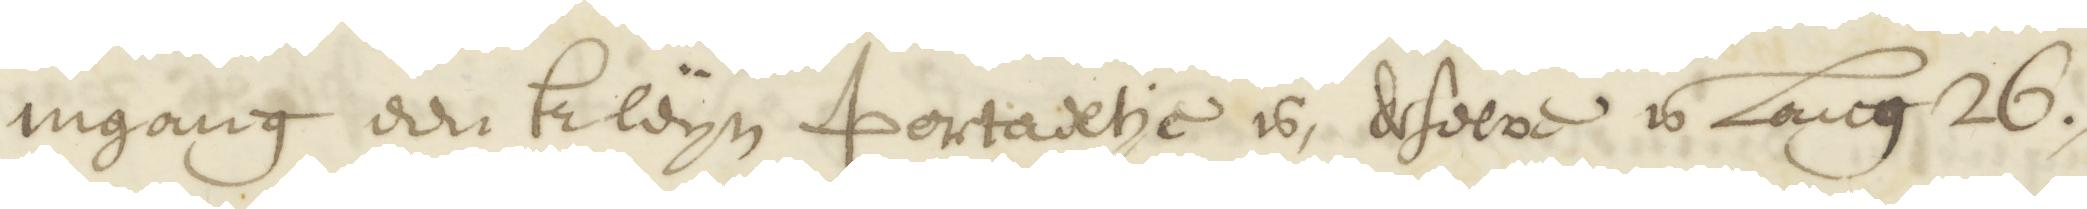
ingang een kleijn portaeltje is, deselve is lang 26.
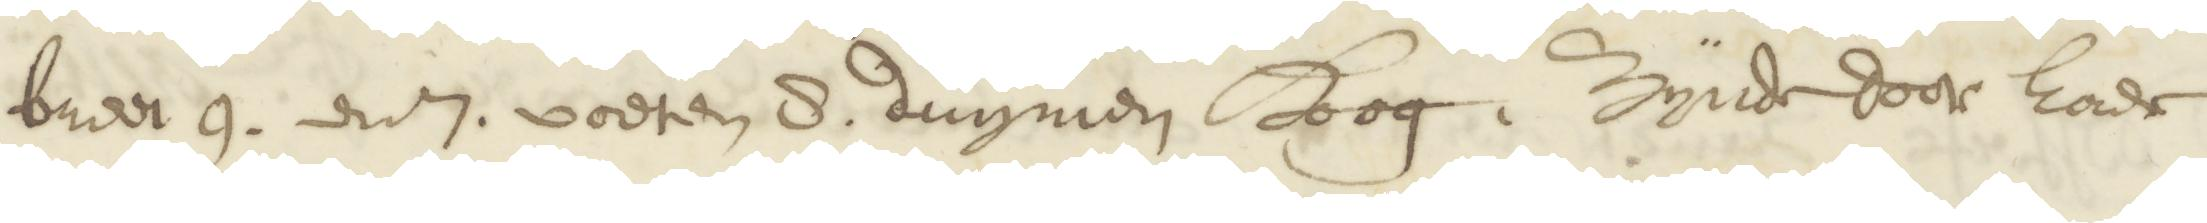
breet 9. en 7. voeten 8. duijmen Hoog. Zijnde door haer
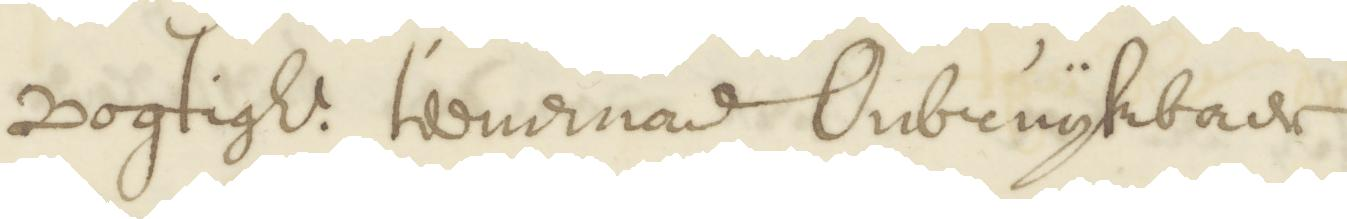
vogtigh:t t'eenemae Onbruijkbaer
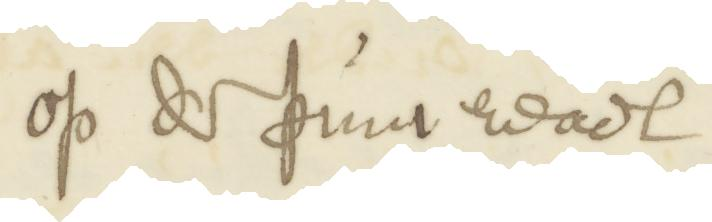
op de punt reael
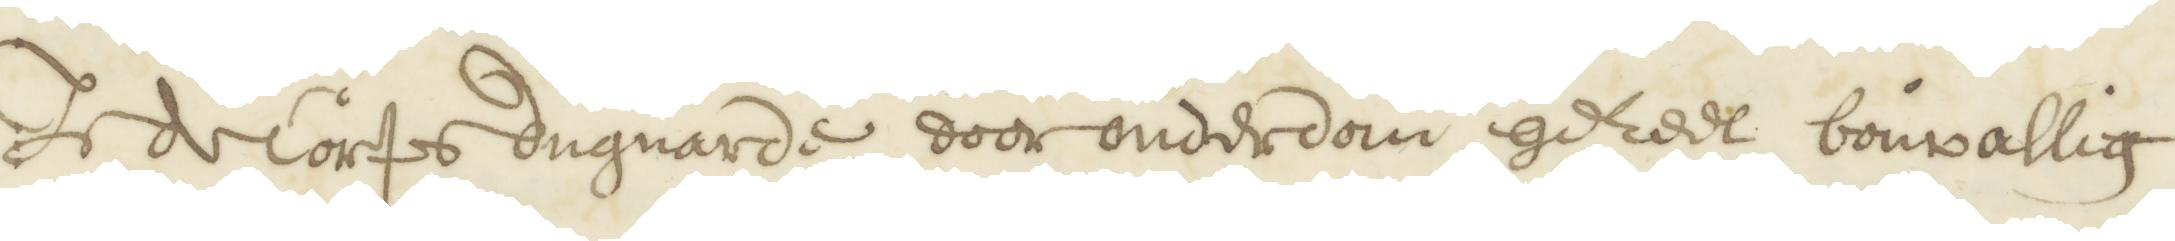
Is de Corps duguarde door ouderdom geheel bouvallig
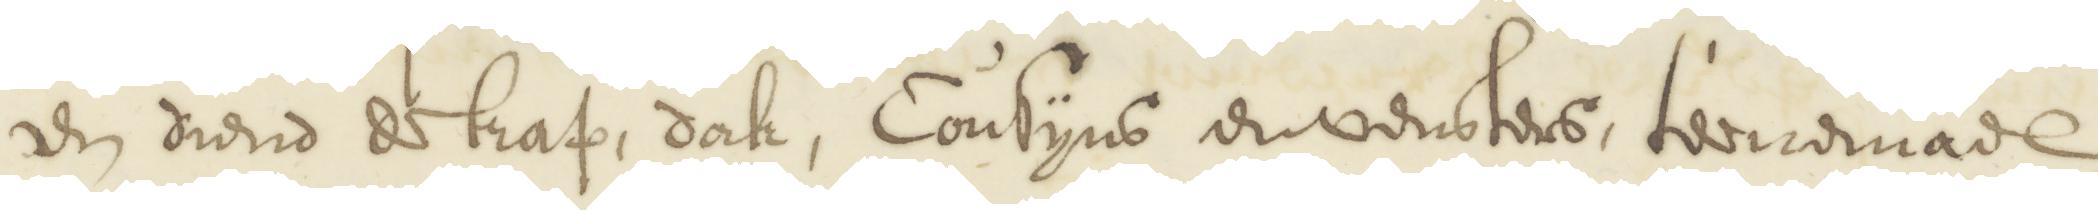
en diend de kap, dak, Cousijns en vensters, t'eenemael
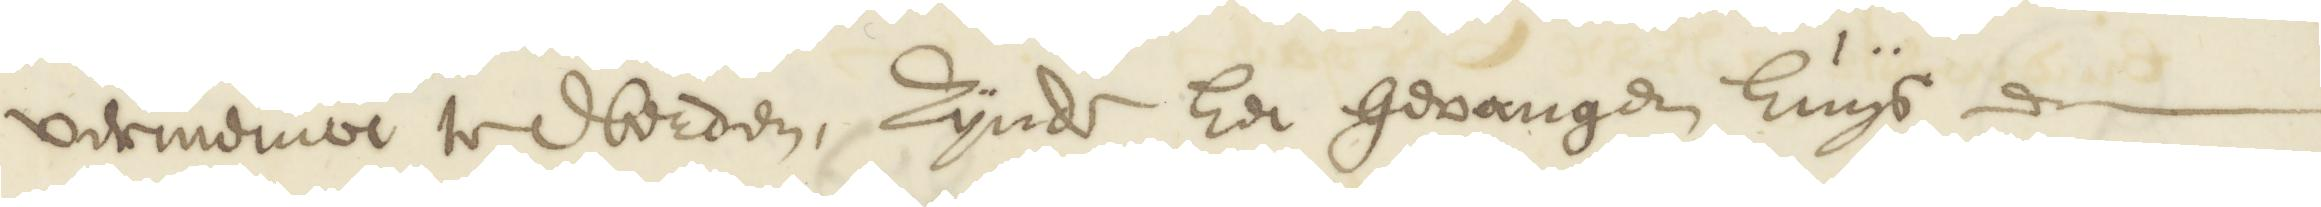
vernieuwt te werden, zijnde het gevangen huijs en
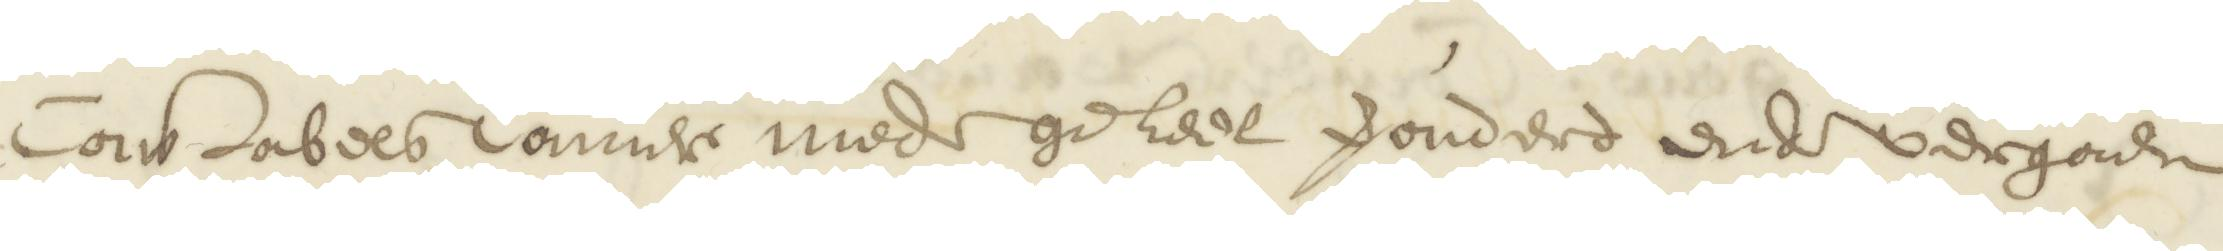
Constabels Camer mede geheel verouderd ende vergaen
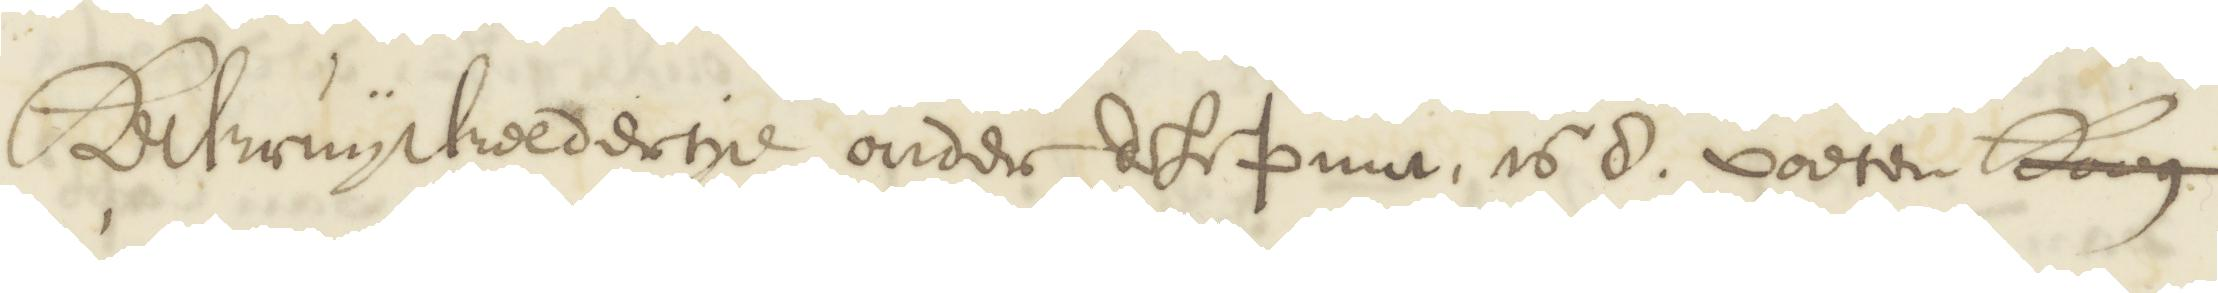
Het kruijtkeldertje onder dese punt, is 8. voeten Hoog
